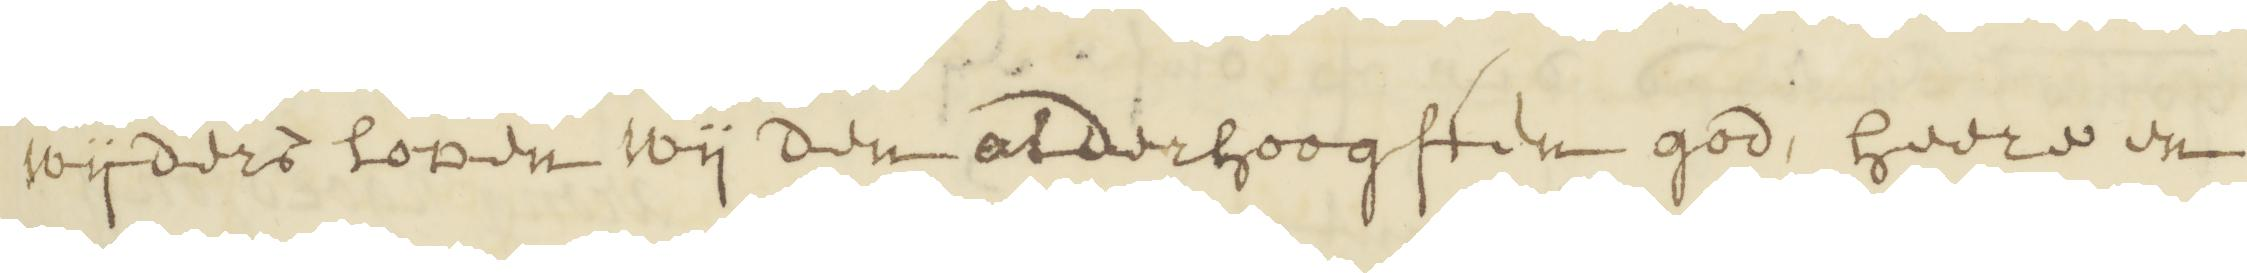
wijders loven wij den alderhoogsten god, heere en
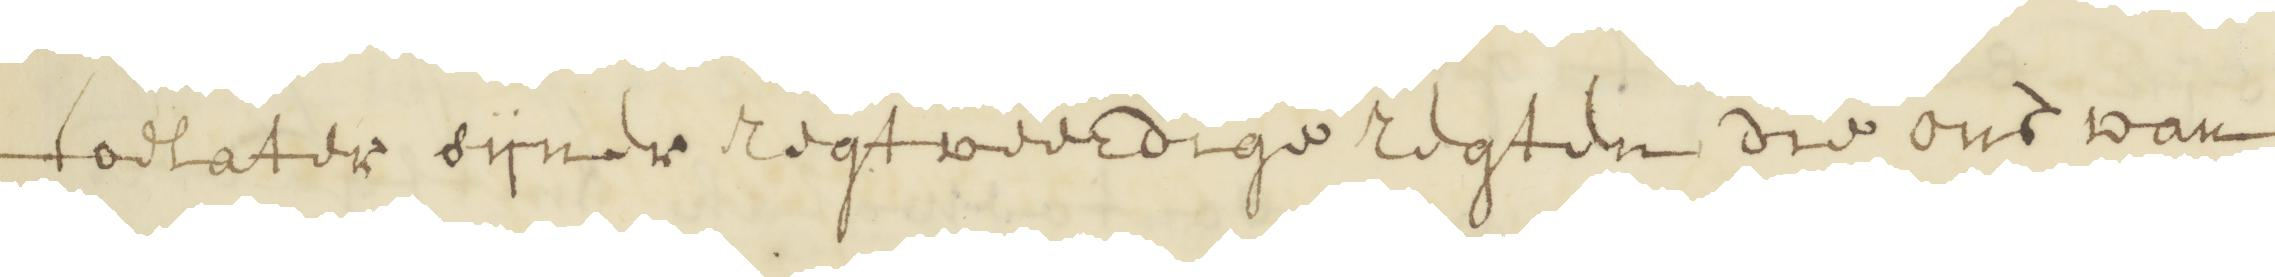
toelater sijner regtveerdige regten die ons van
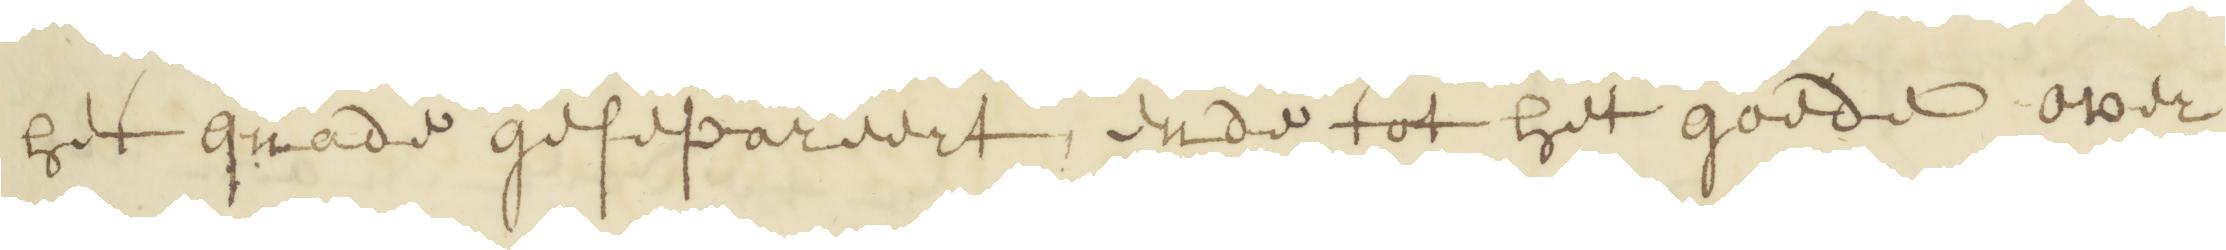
het quade gesepareert, ende tot het goede over
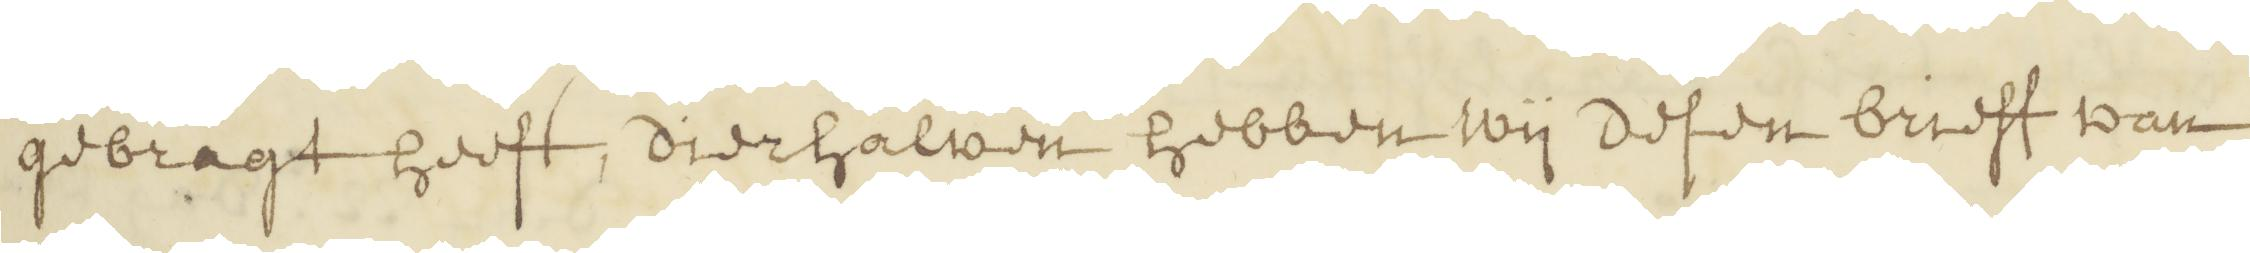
gebragt heeft, dierhalven hebben wij desen brieff van
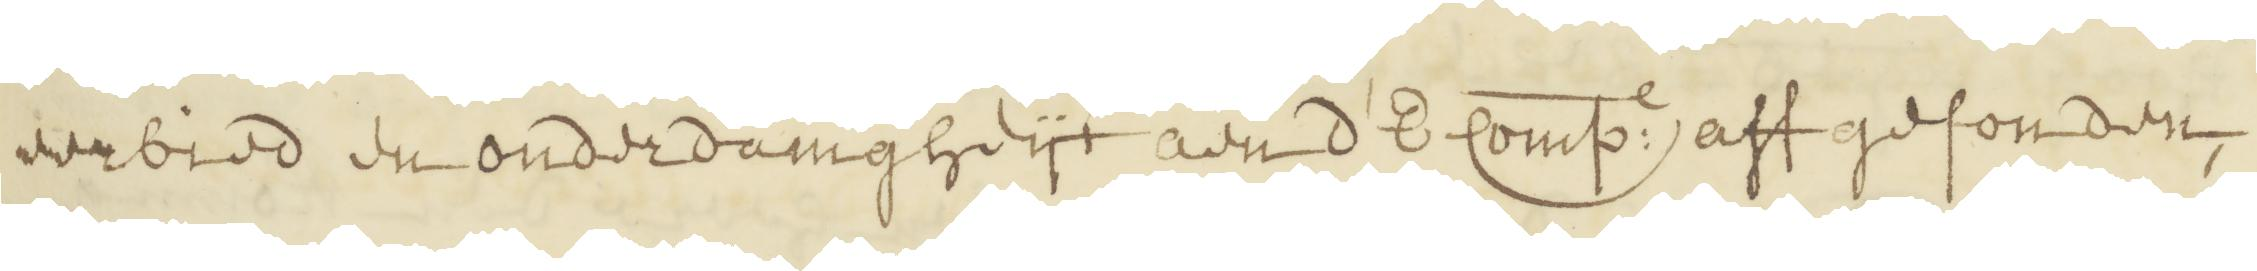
eerbied en onderdanigheijt aen d’E Comp:e affgesonden,
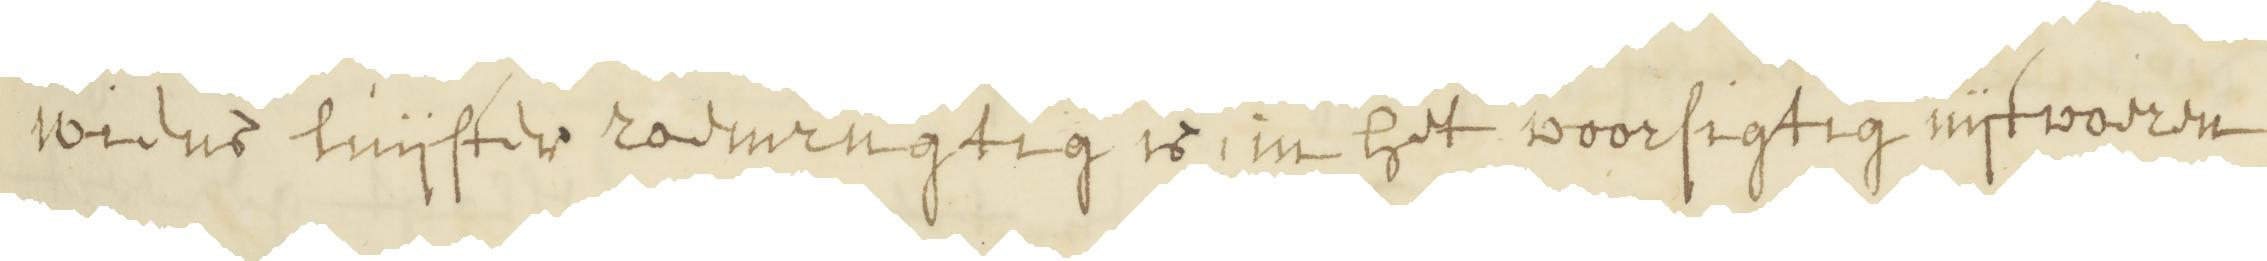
wiens luijster roemrugtig is, in het voorsigtig uijtvoeren
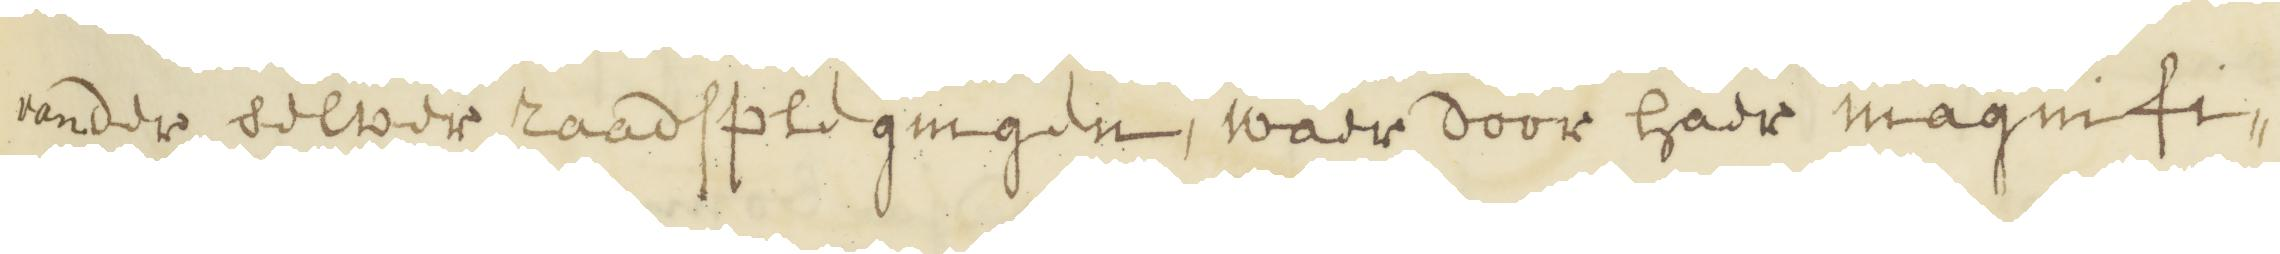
van der selver raadsplegingen, waer door haer magnifi„
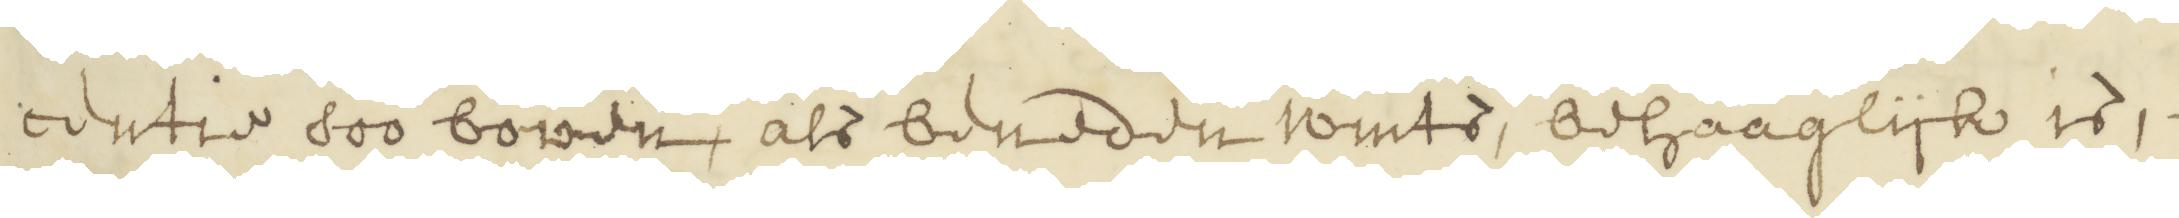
centie soo boven, als beneden wints, behaaglijk is,-
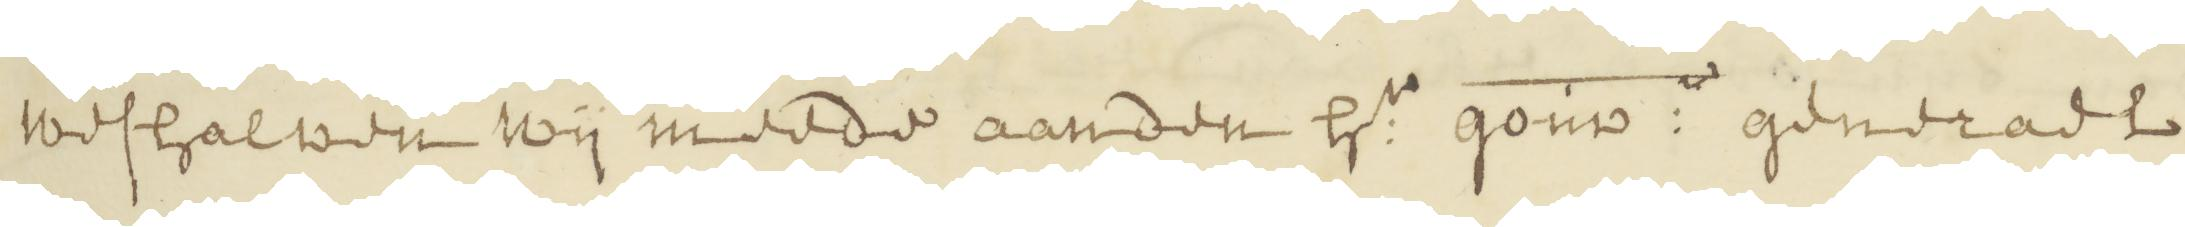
weshalven wij meede aanden h:r gouv:r generael
